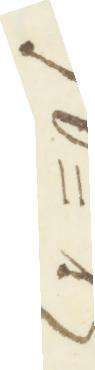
N=o 13
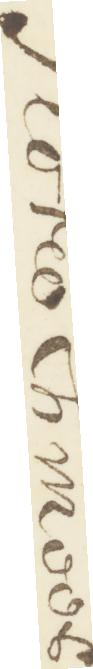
Sioko chinees
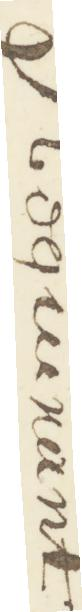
Requirant
